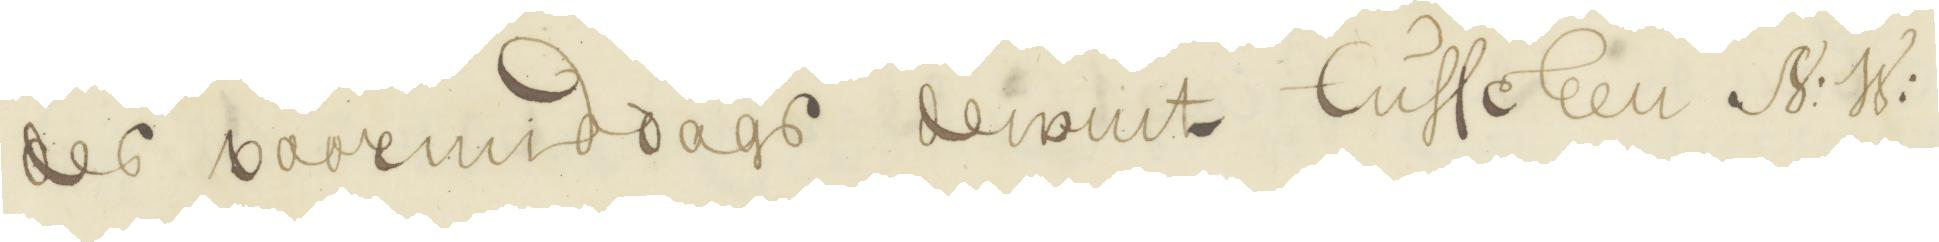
des voormiddags de wint tusschen N: W:
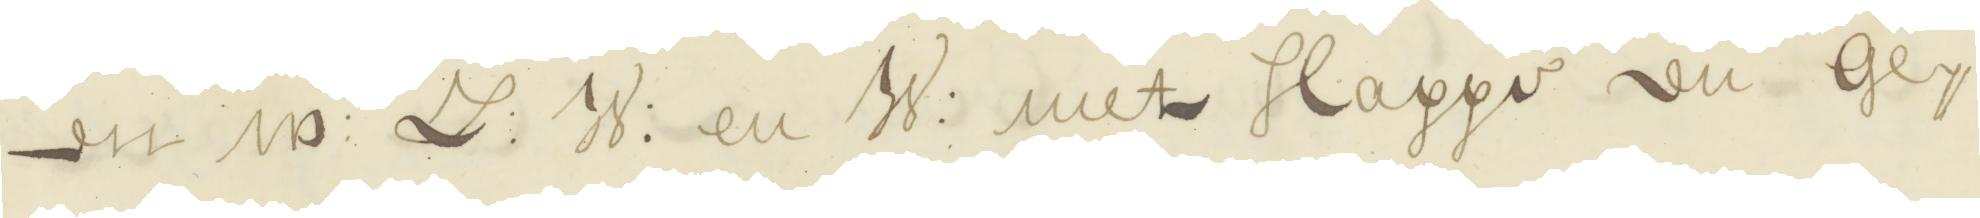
en w: Z: W: en W: met slappe en ge„
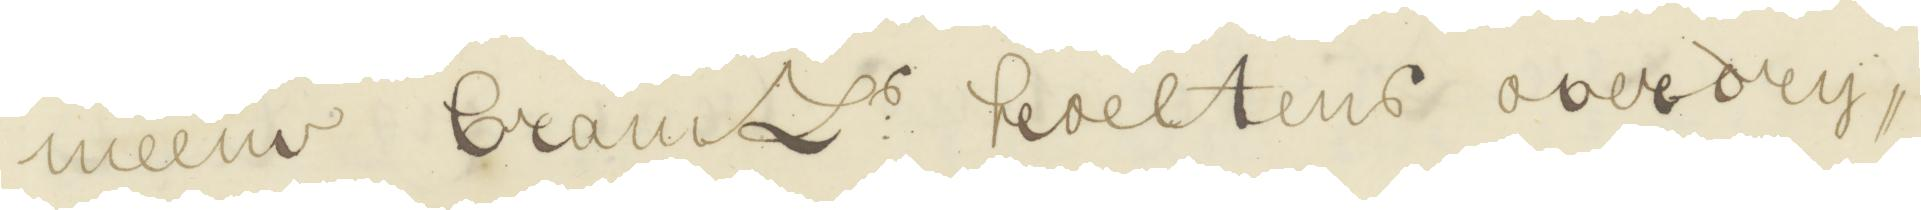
meene bramz:s koeltens overdrij„
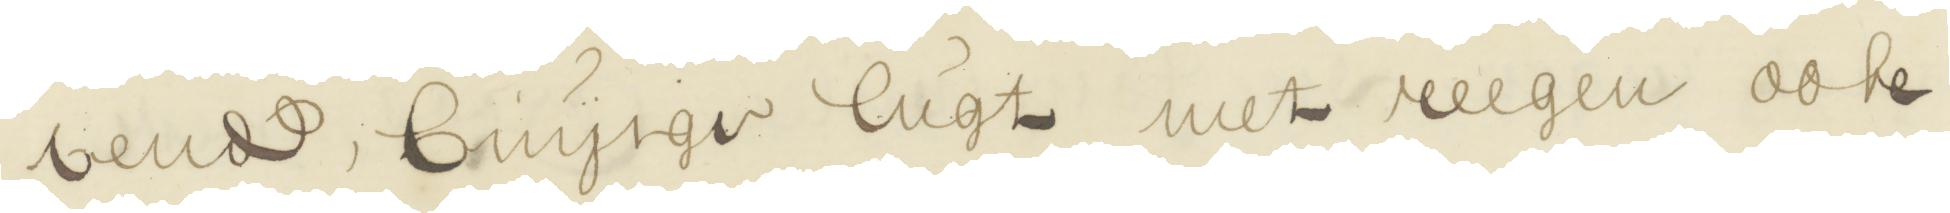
vende; buijige lugt met reegen ook
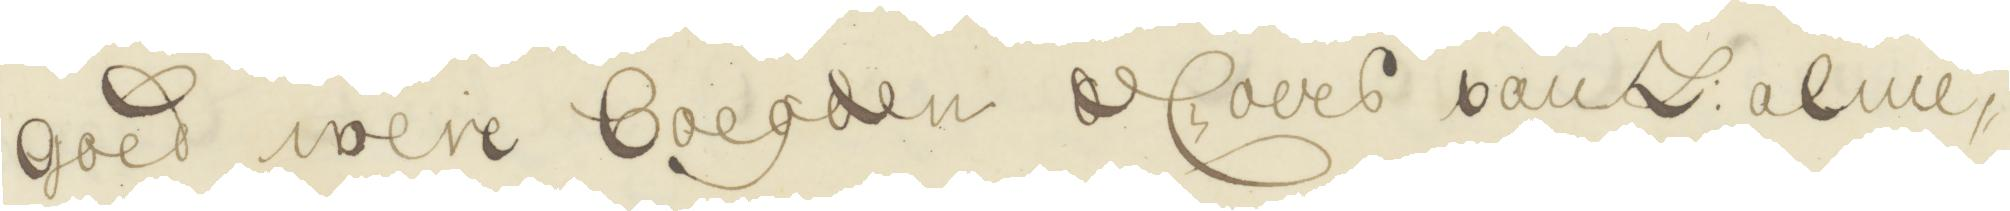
goed were voegden de Coers van Z: alme„
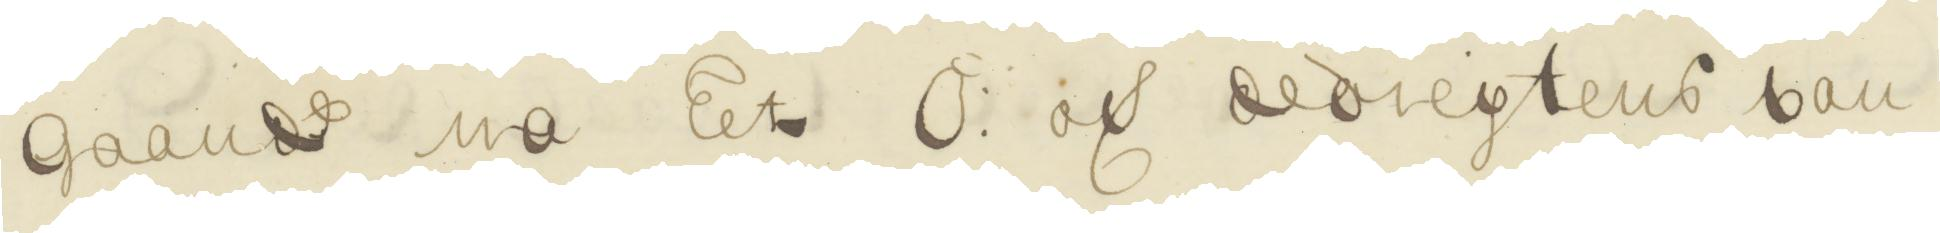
gaande na het O: over de dieptens van
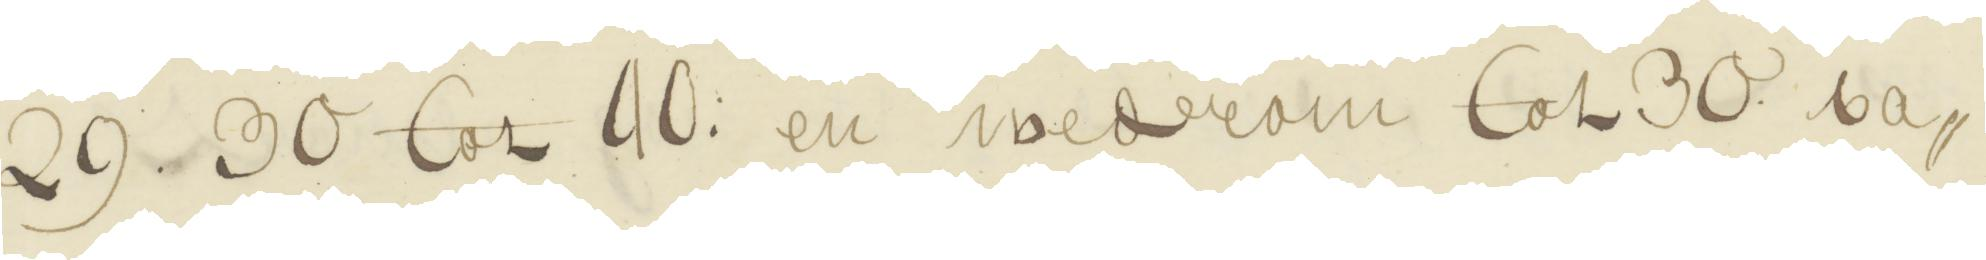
29. 30 tot 40: en wederom tot 30. va
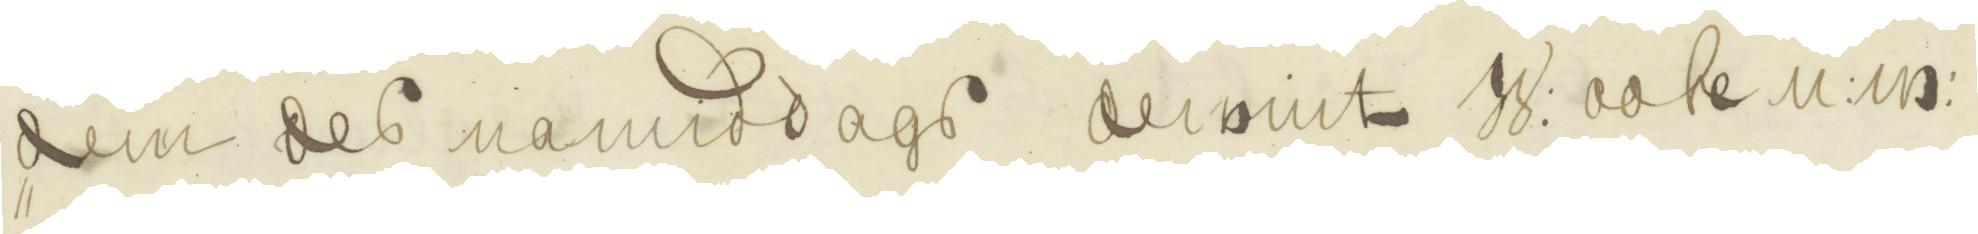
„dem des namiddags de wint W: ook n: w:
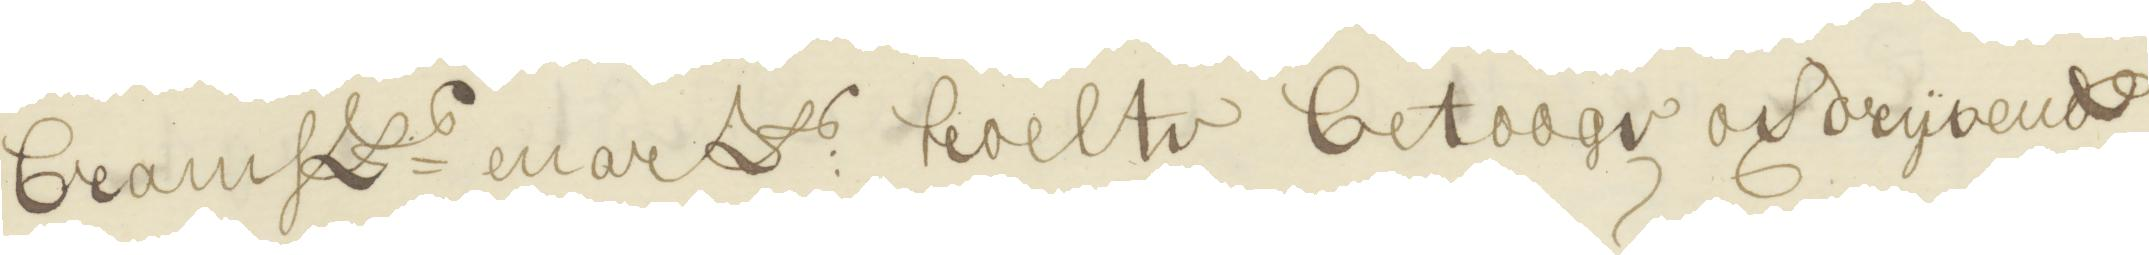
bramz=s en arz:s koelte betooge over drijvende
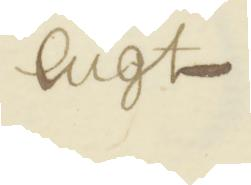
lugt
